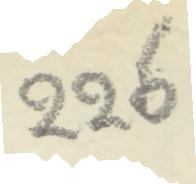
226
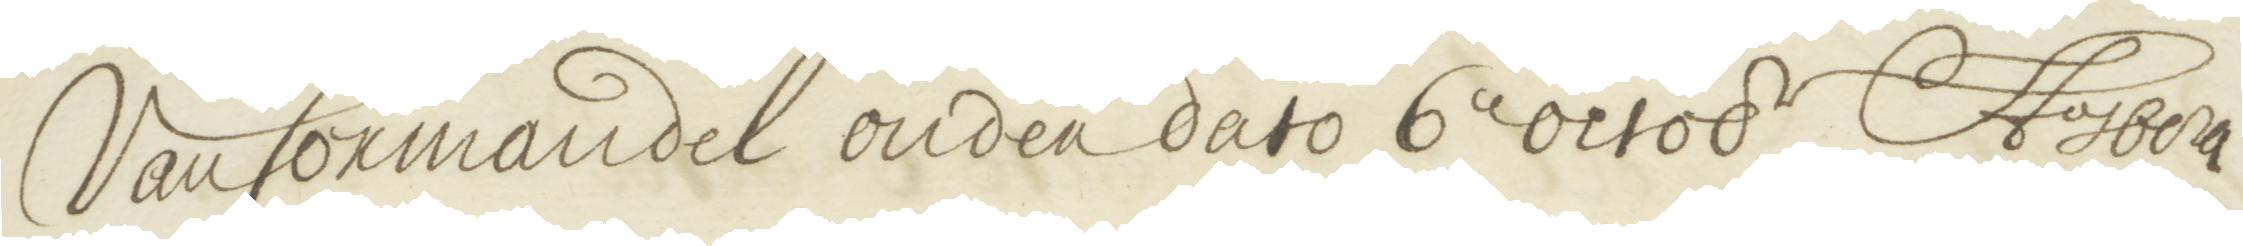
Van Cormandel onder dato 6' octobr Ao 1684
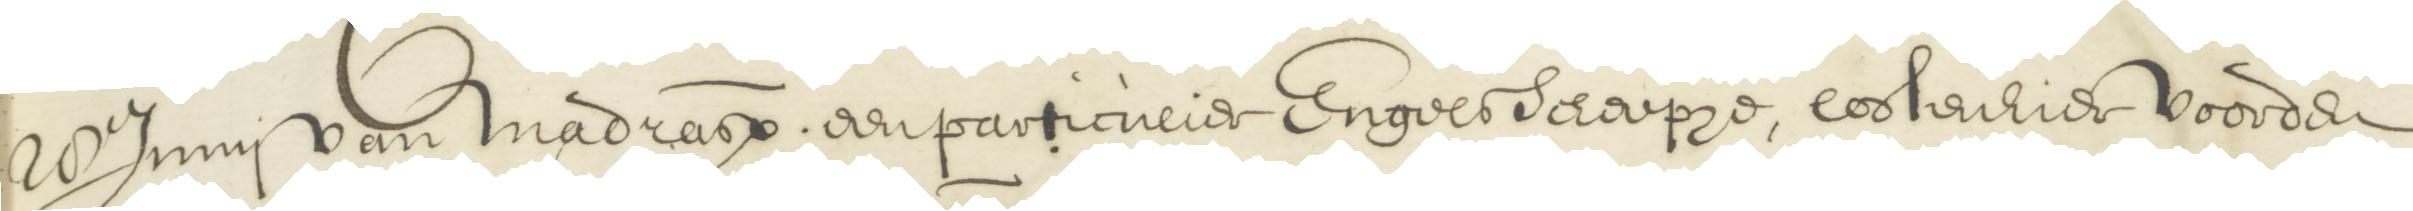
28 Junij van madras p. een particulier Engelsscheepje, losten hier voorden
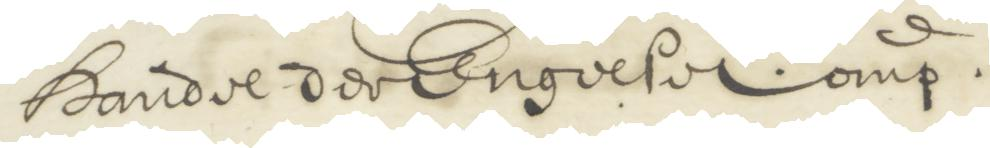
Handel der Engelse Comp.
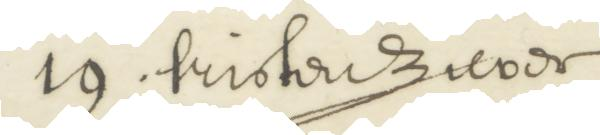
19. kisten zilver
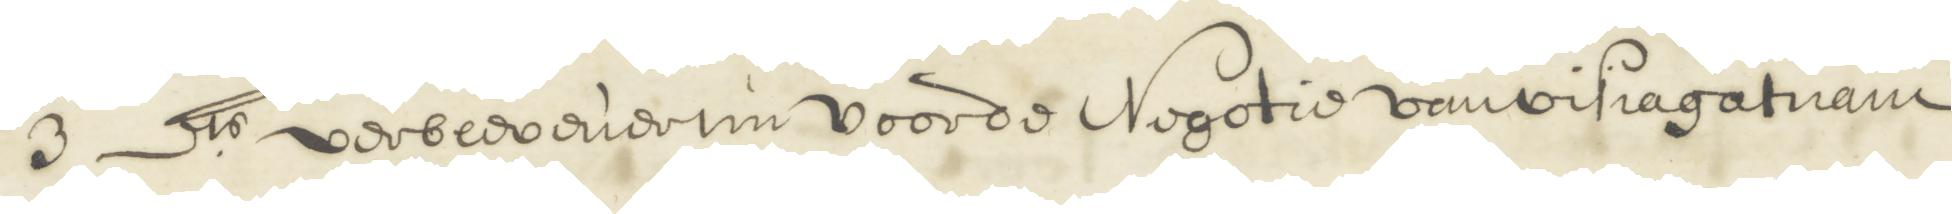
3 d.ts verbleven er nu voor de Negotie van visiagatnam
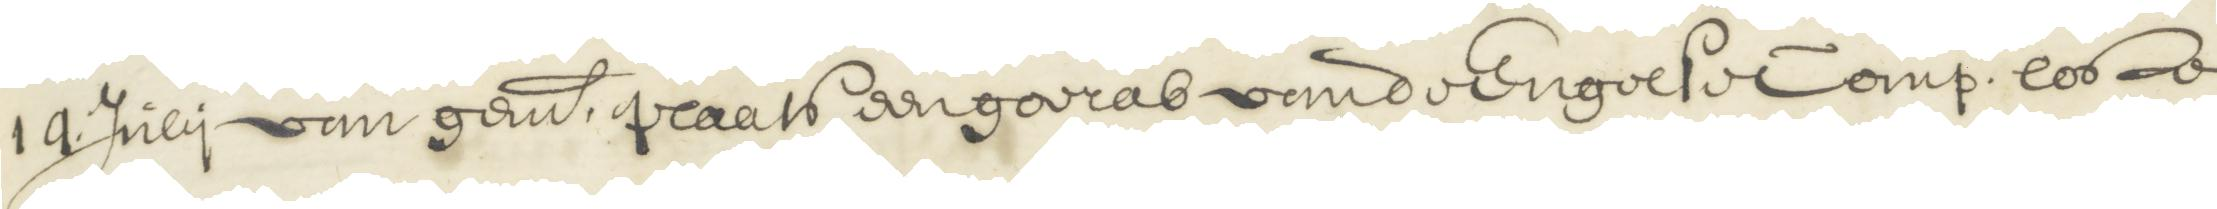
14. Julij van gem: plaats een goerab van de Engelse Comp. loste
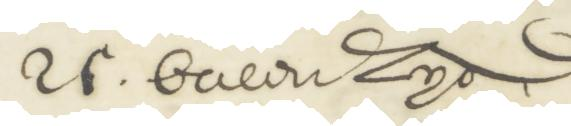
25. balen zijd
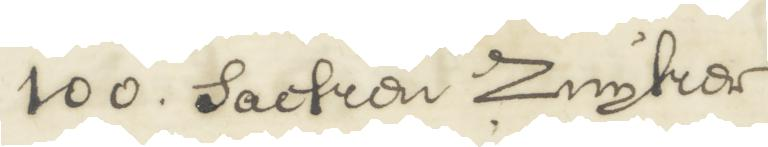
100. sacken Zuijker
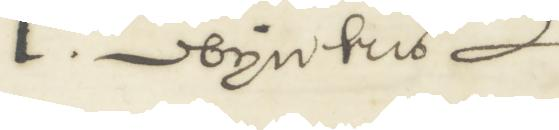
1. wijn kist
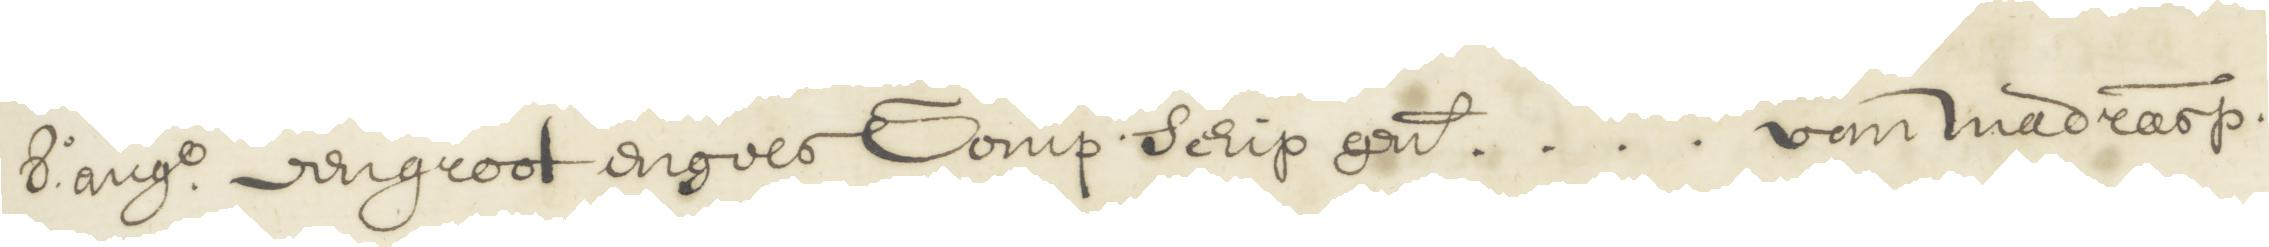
8.' aug:o een groot engels Comp:s schip gend . . . . van madrasp.
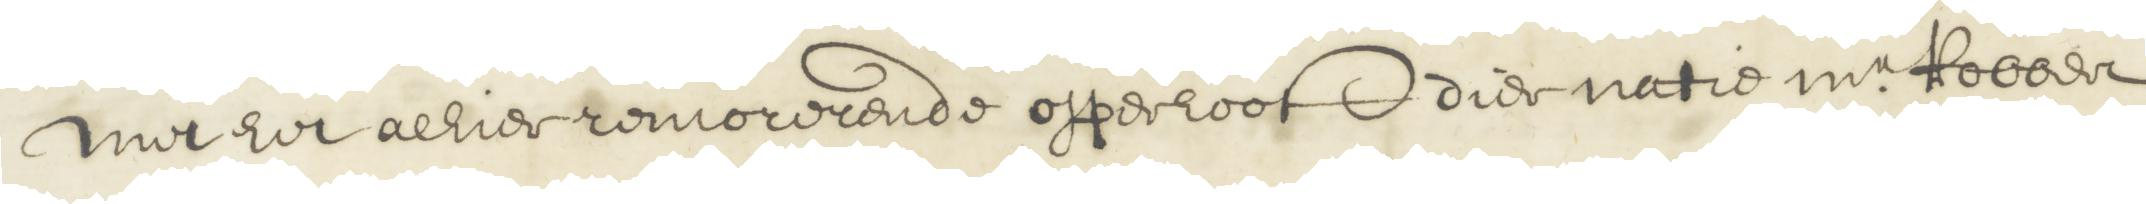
met het alhier remorerende opperhooft dier natie m.r Robbert
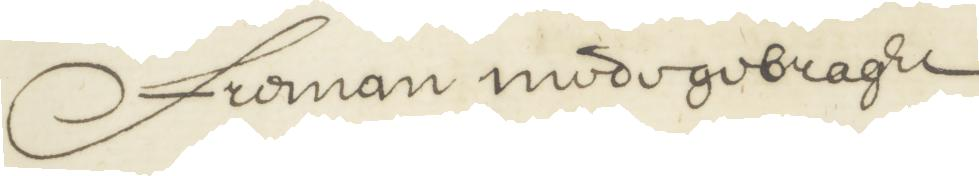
freman medegebraght
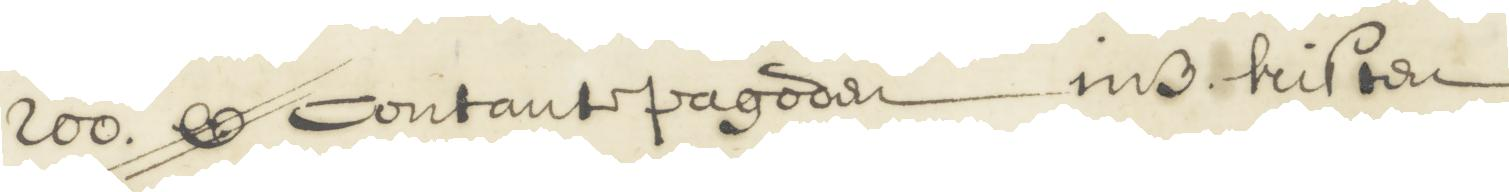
200. Ø contant pagoden in 3. kisten
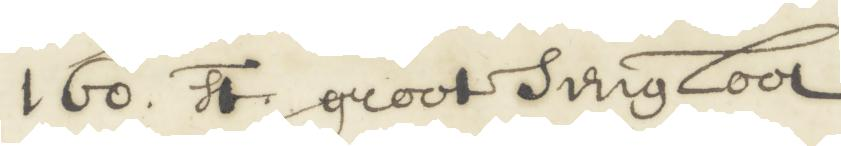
160. st. groot sengloot
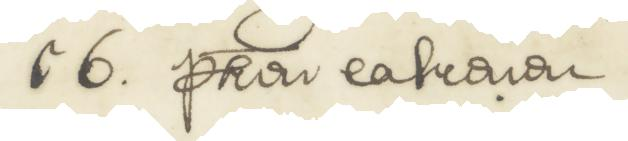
56. pken lakenen
